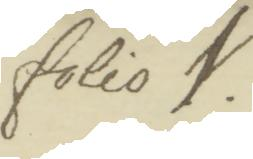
folio 1.
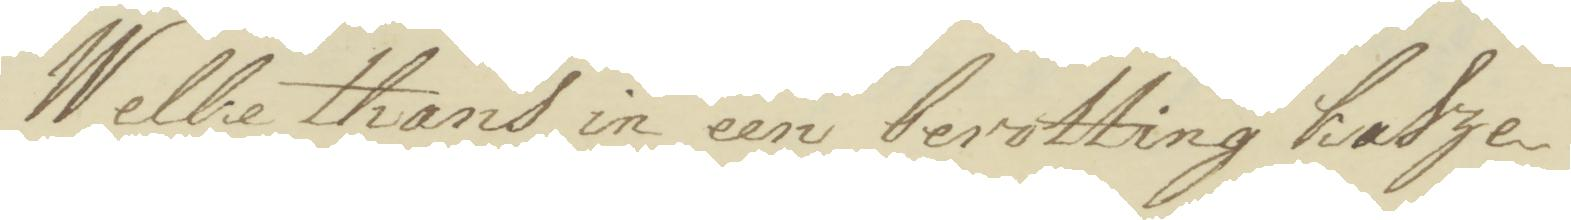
Welke thans in een berotting kasje
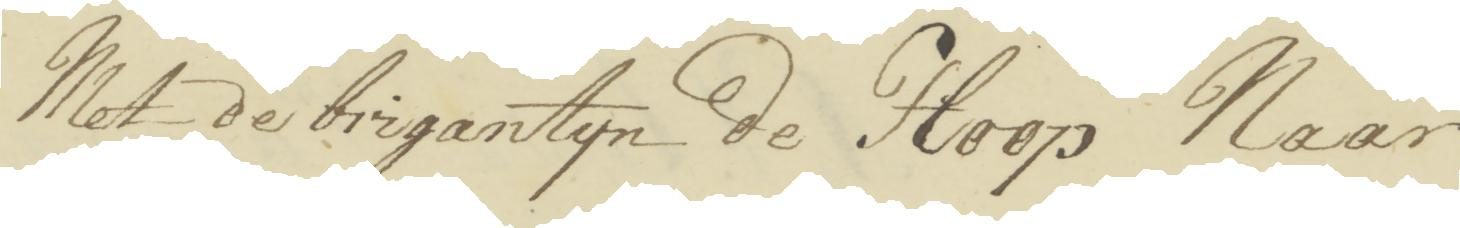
Met de brigantyn de Hoop Naar
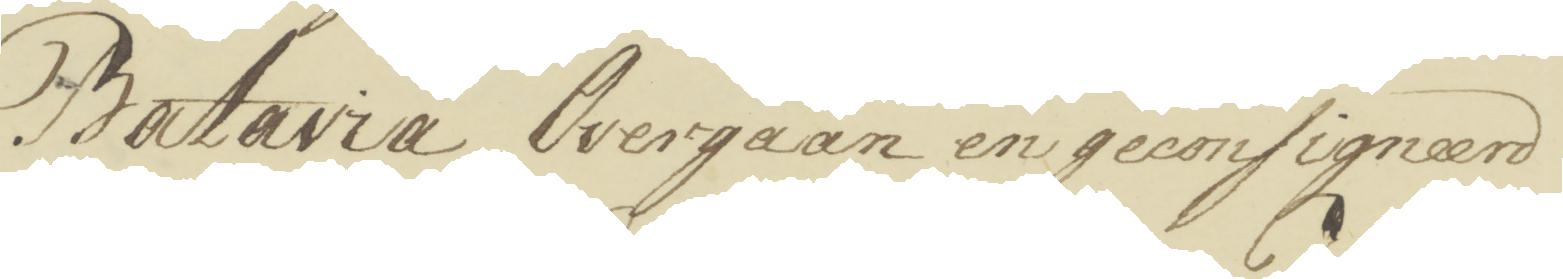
Batavia Overgaan en geconsigneerd
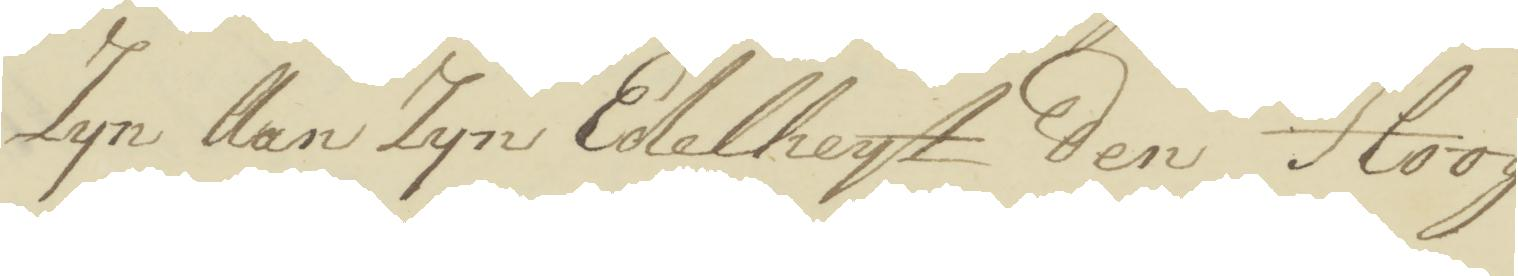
Zyn Aan Zyn Edelheyt den Hoog
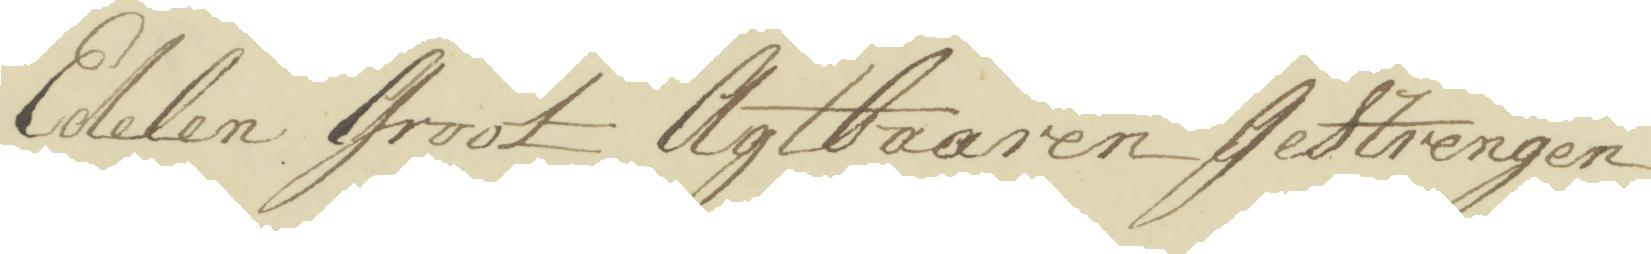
Edelen Groot Agtbaaren Gestrengen
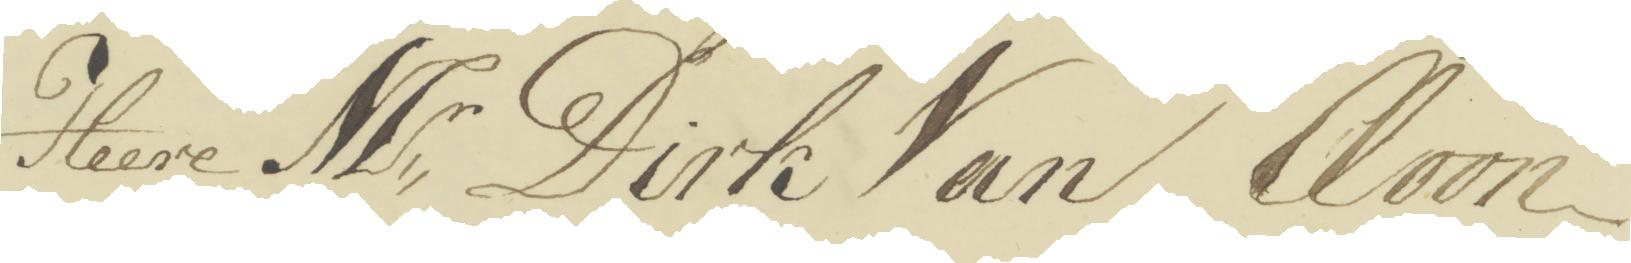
Heere M„r Dirk Van Cloon
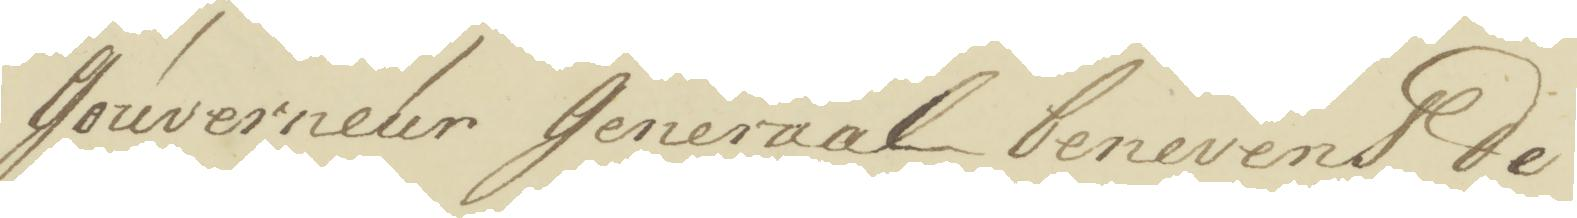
Gouverneur Generaal benevens de
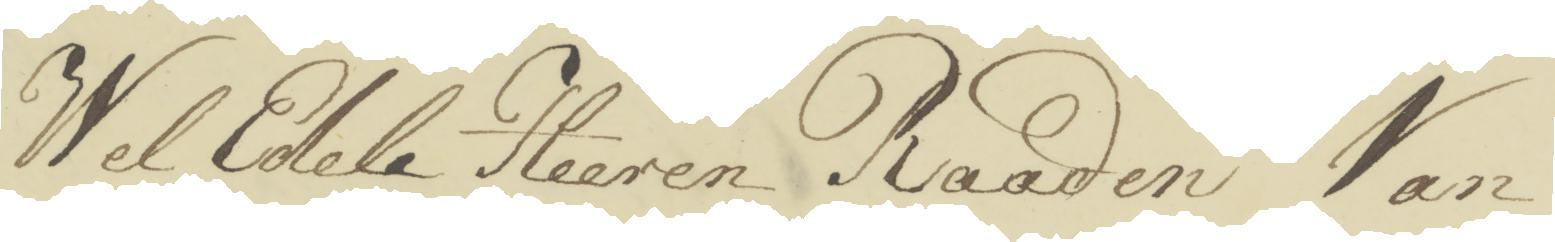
Wel Edele Heeren Raaden Van
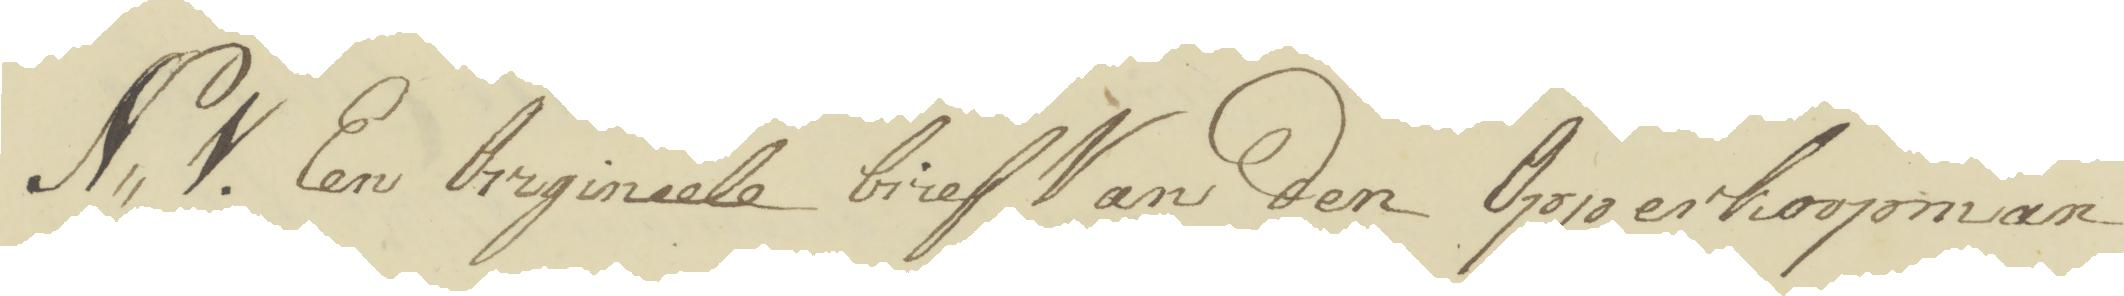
N„ 1. Een Origineele brief Van den Opperkoopman
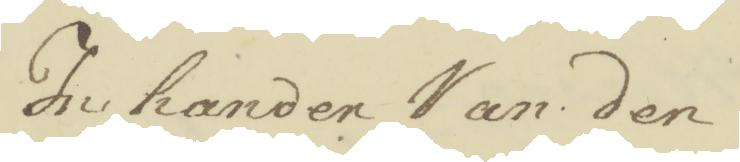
In handen Van den
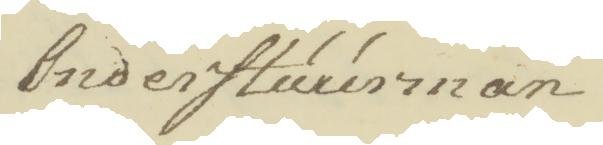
Onderstuurman
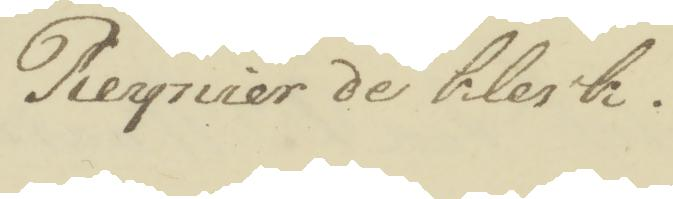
Reynier de klerk.
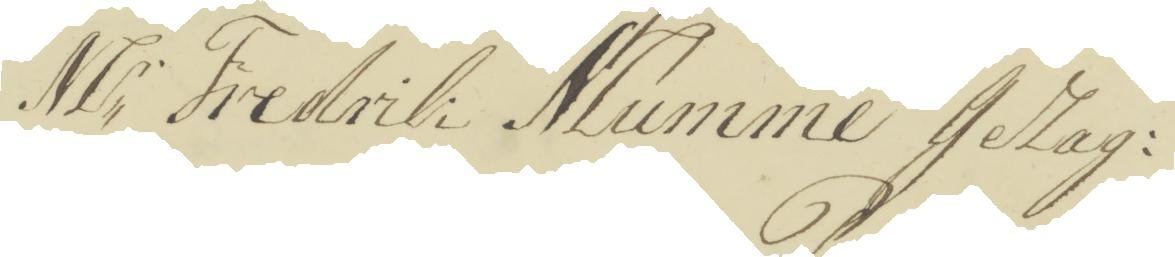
M„r Fredrik Mumme gezag:
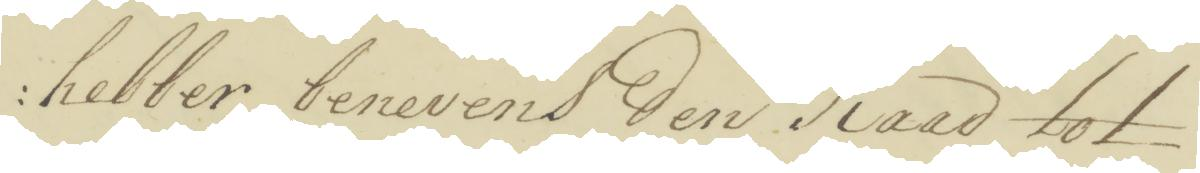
:hebber benevens den Raad tot
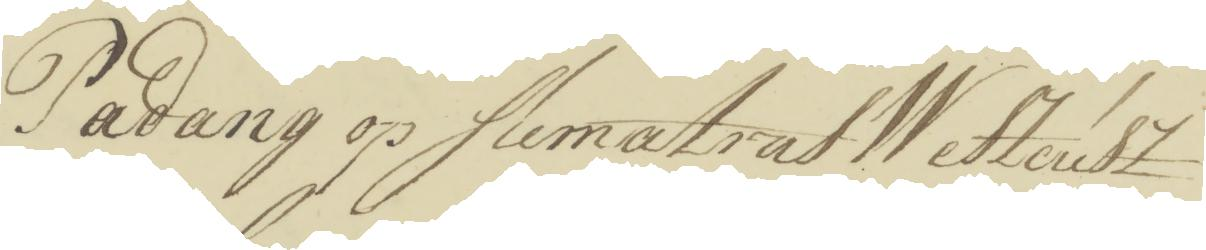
Padang op sumatras Westcust
